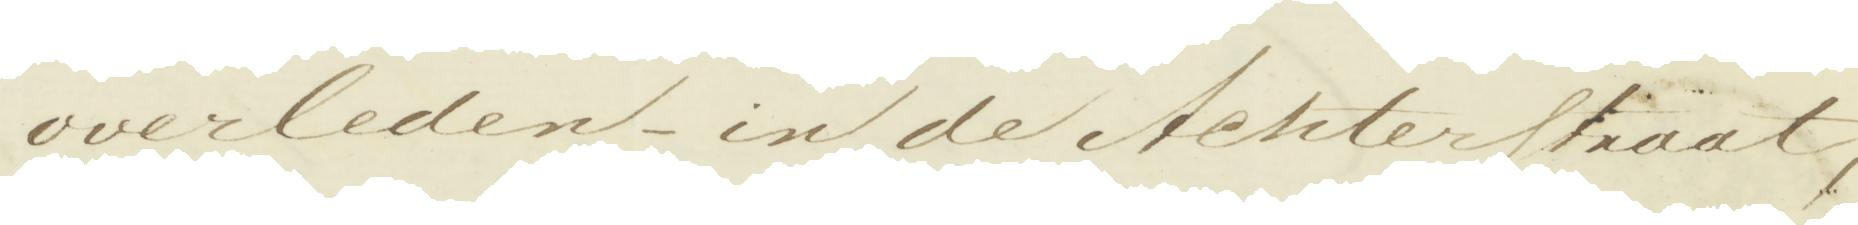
overleden- in de Achterstraat,
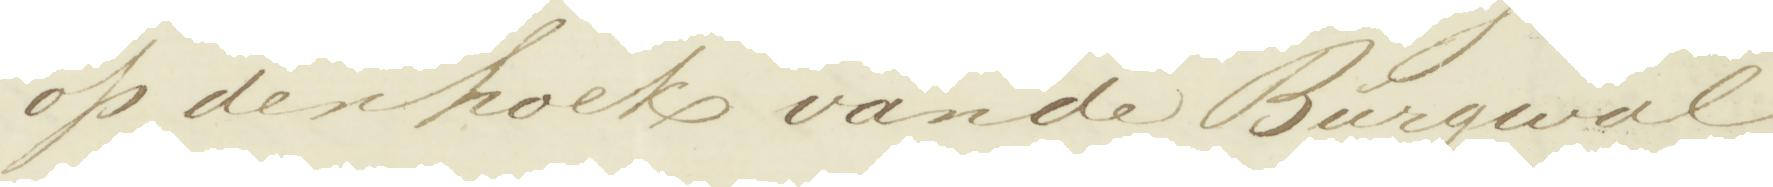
op den hoek van de Burgwal,
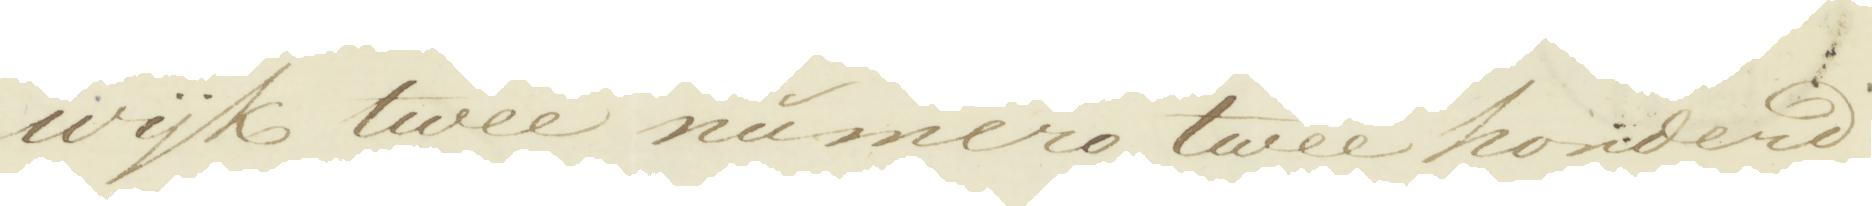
wijk twee numero twee honderd
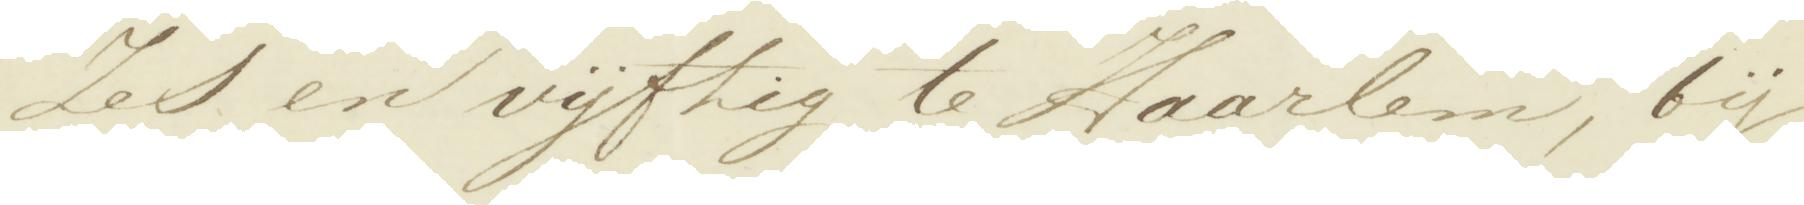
zes en vijftig te Haarlem, bij
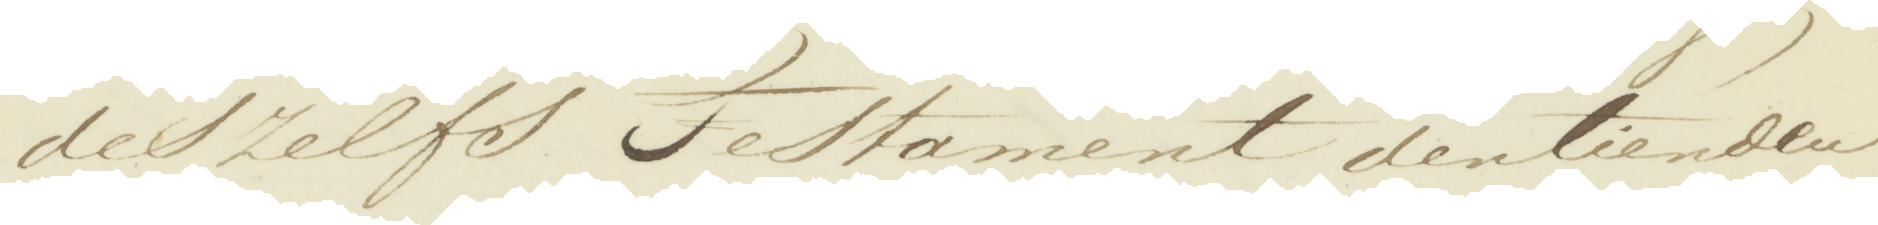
deszelfs Testament den tienden
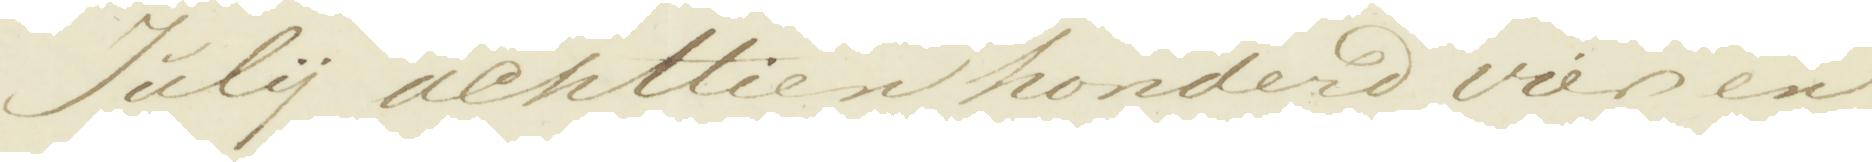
Julij achttien honderd vier en
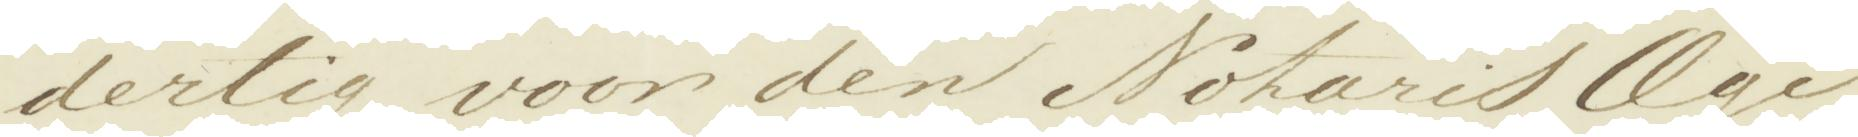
dertig voor den Notaris AEgi
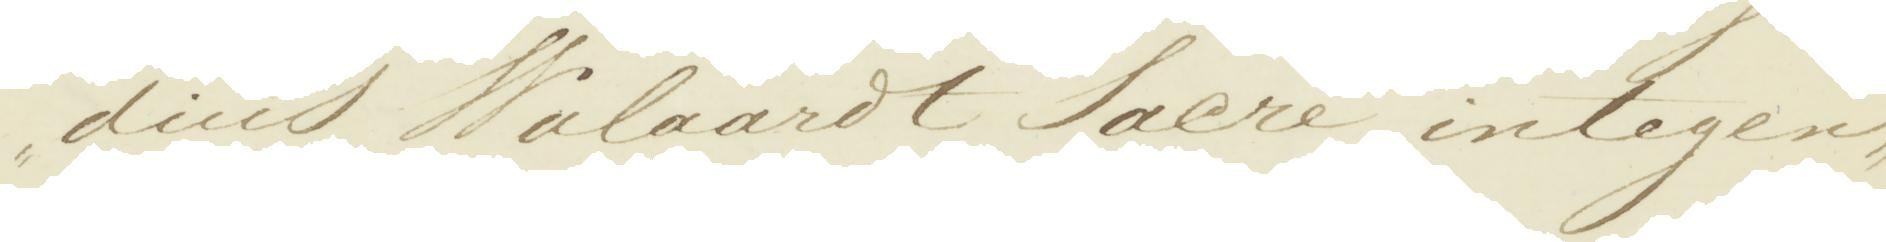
„dius Walaardt Sacré, integen
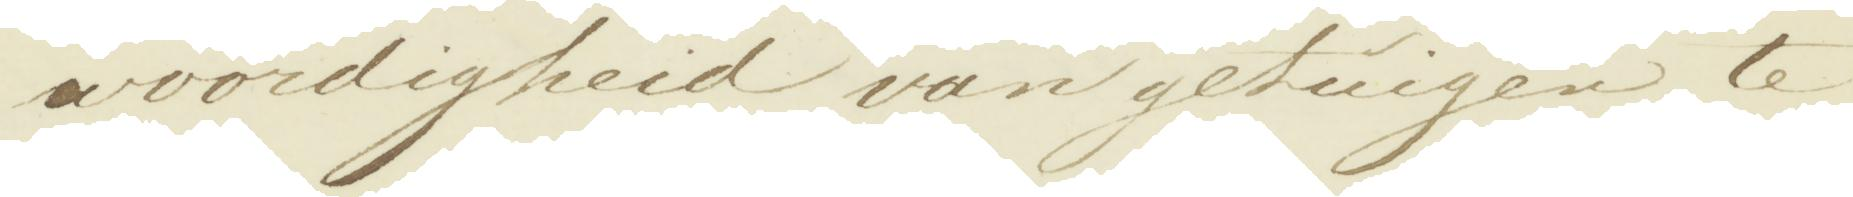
woordigheid van getuigen, te
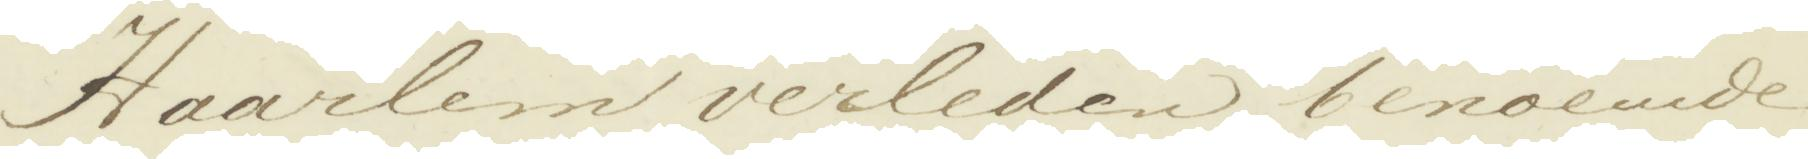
Haarlem verleden, benoemde
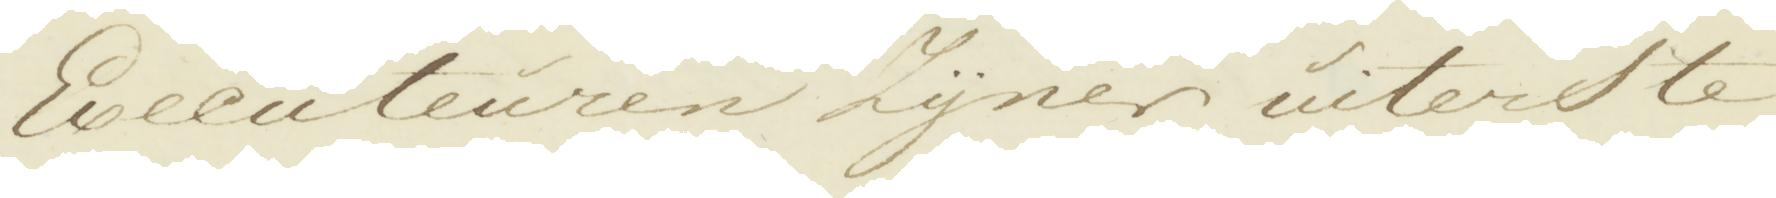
Executeuren zijner uiterste
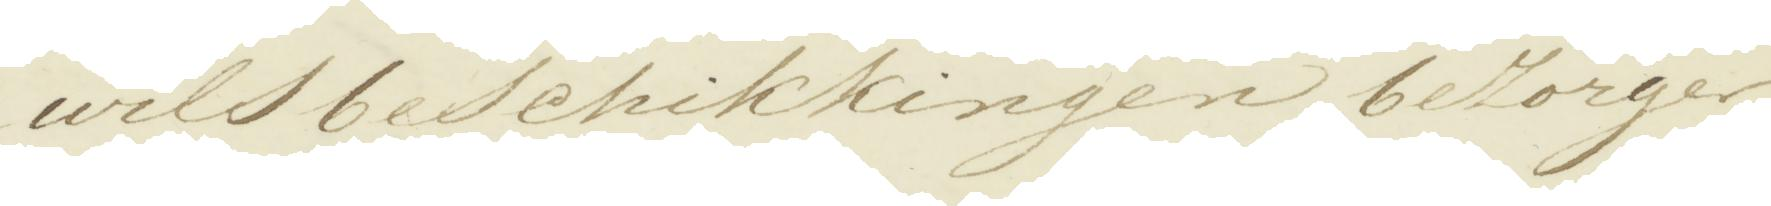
wils beschikkingen, bezorgers
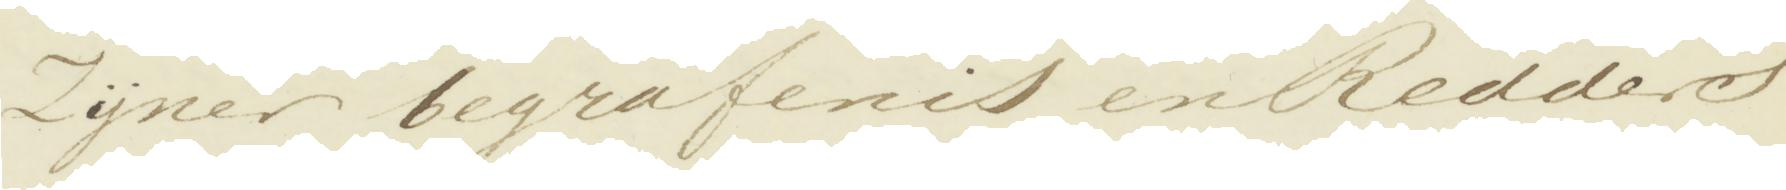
zijner begrafenis en Redders
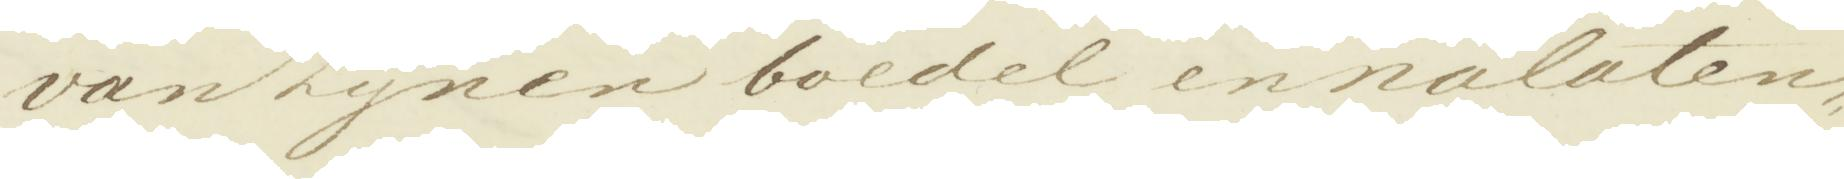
van zijnen boedel en nalaten„
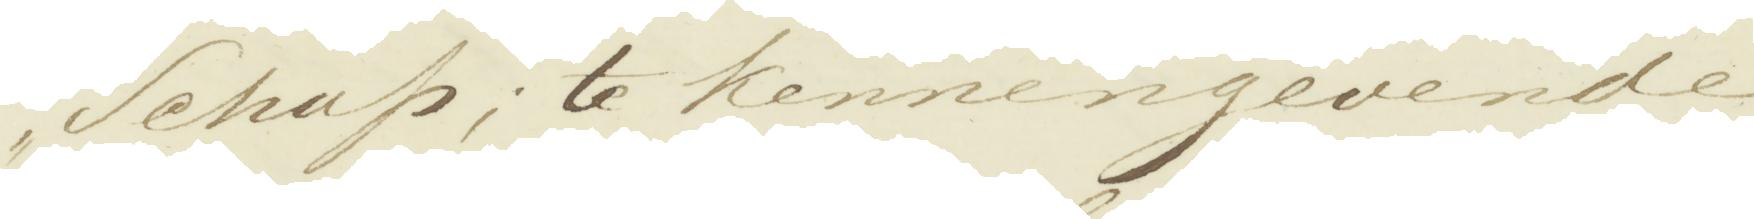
„schap; te kennen gevende
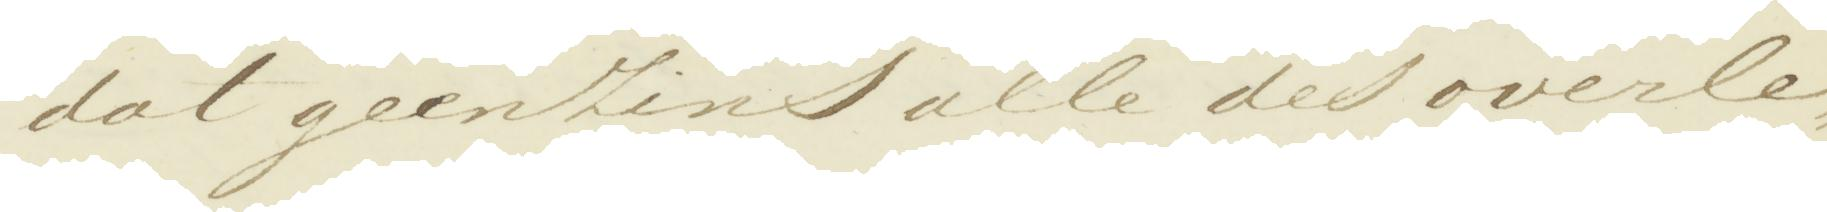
dat geenzins alle des overle
